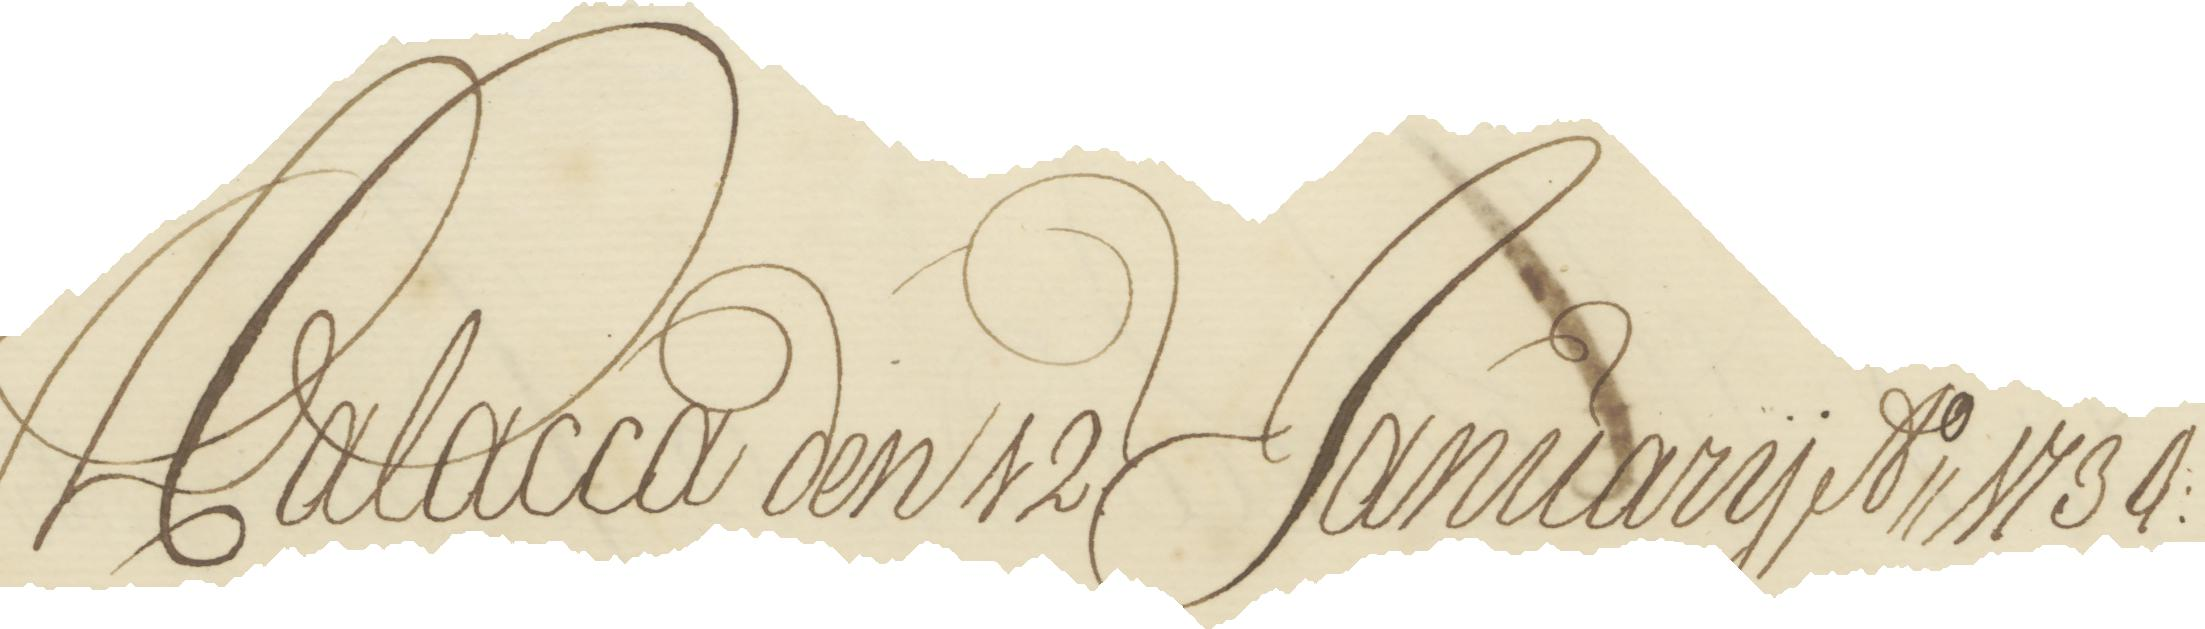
Van Malacca den 12: Januarij A„o 1734:
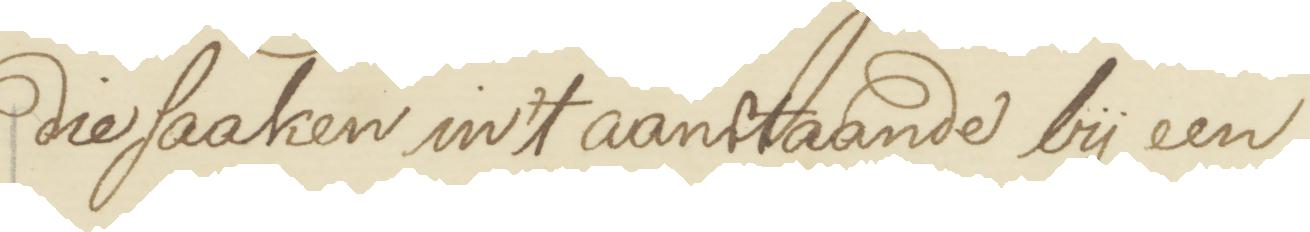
die saaken in ’t aanstaande bij een
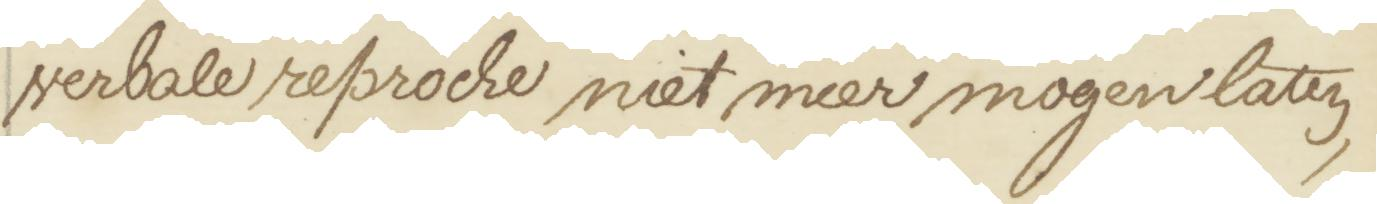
verbale reproche niet meer mogen laten
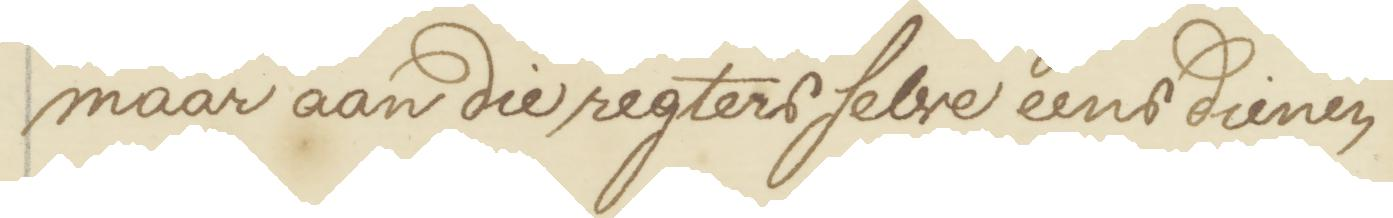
maar aan die regters selve eens dienen
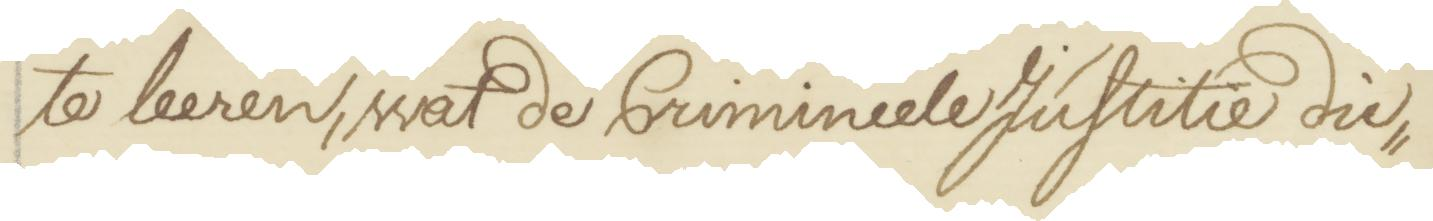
te leeren, wat de crimineele Justitie dic„
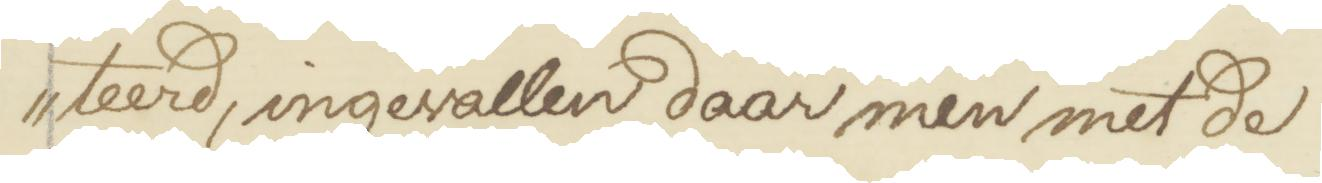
„teerd, ingevallen daar men met de
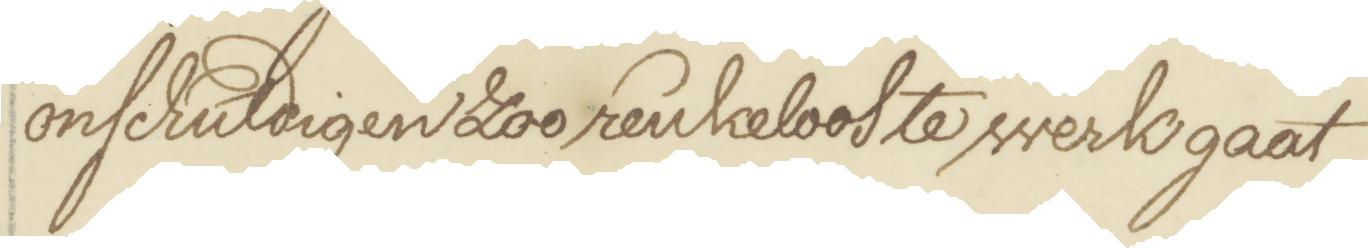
onschuldigen zoo reukeloos te werk gaat
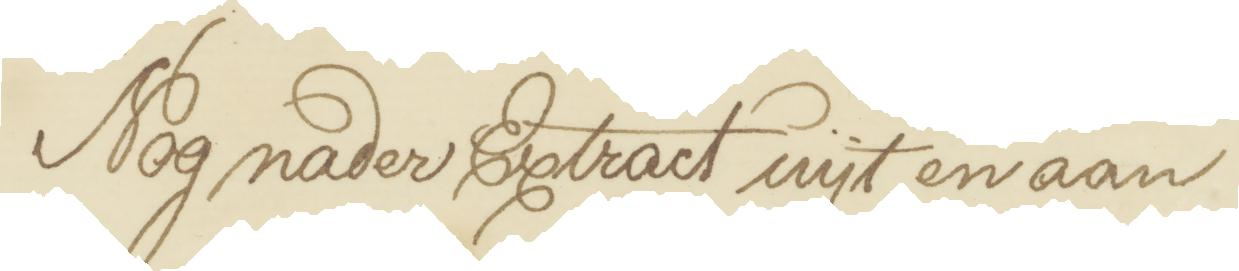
Nog nader Extract uijt en aan
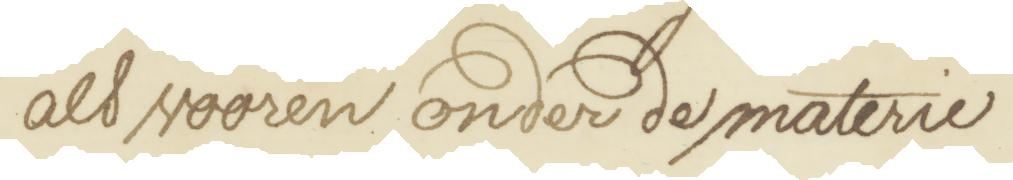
als vooren onder de materie
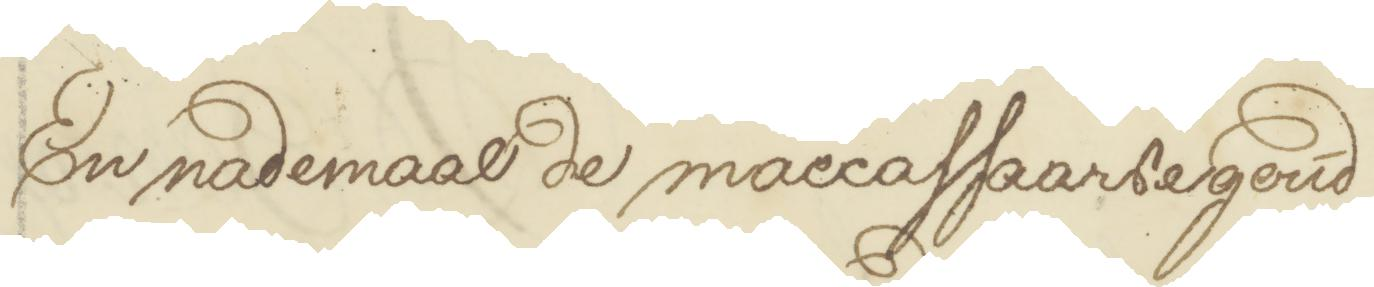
En nademaal de maccassaarse goud
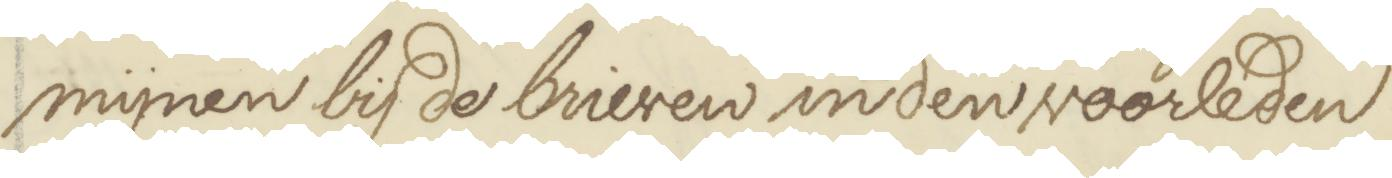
mijnen bij de brieven in den voorleden
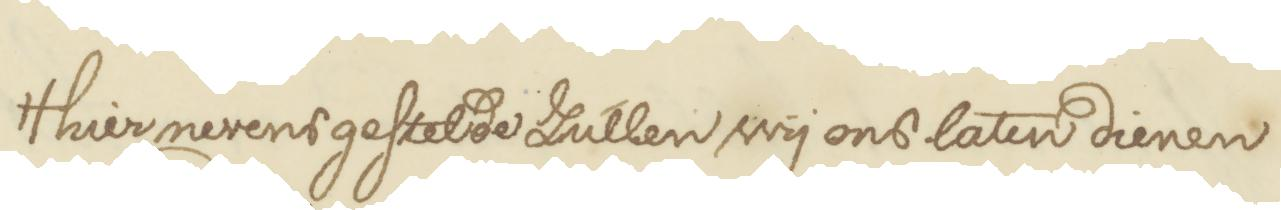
'thier nevens gestelde zullen wij ons laten dienen
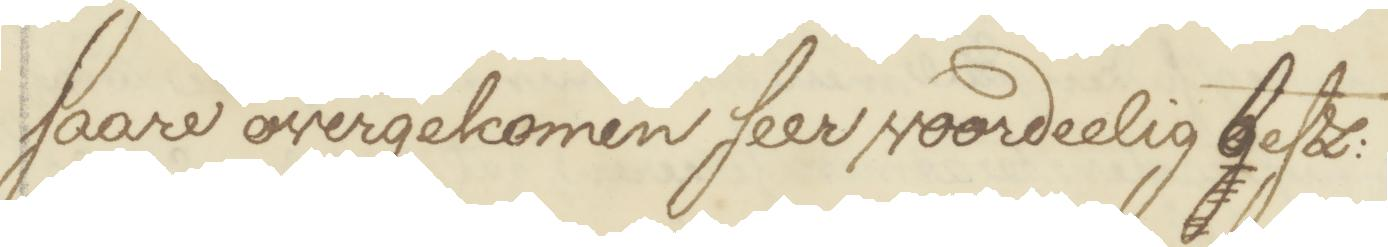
jaare overgekomen seer voordeelig besz:
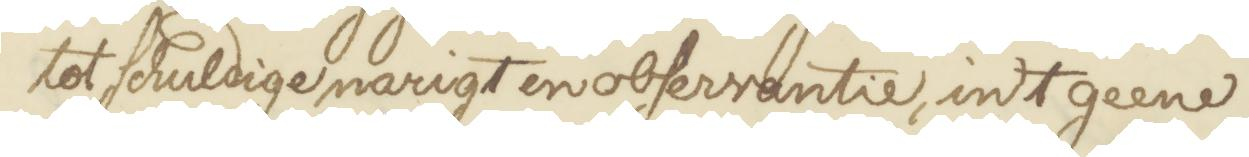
tot schuldige narigt en observantie, in ’t geene
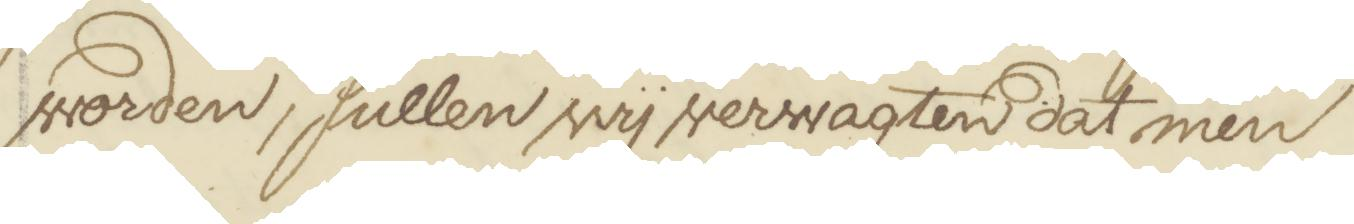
worden, sullen wij verwagten dat men
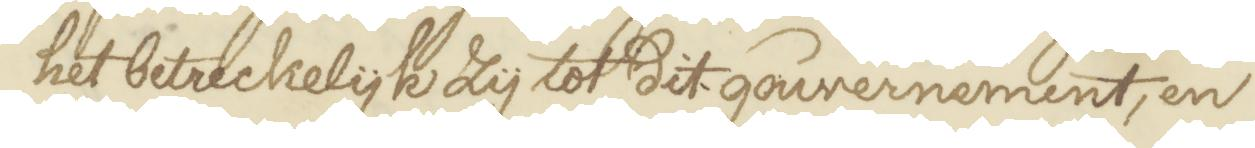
het betreckelijk zij tot dit gouvernement, en
